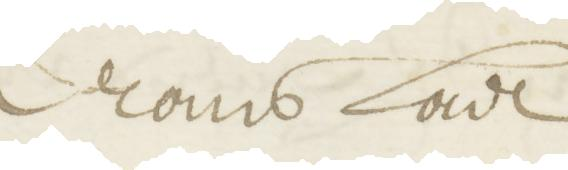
Translaet
